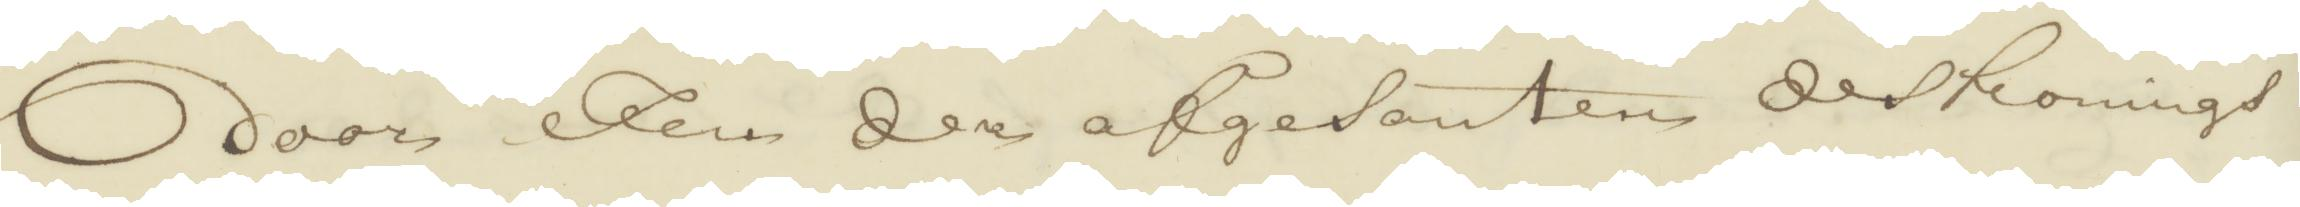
door Een der afgesanten des konings
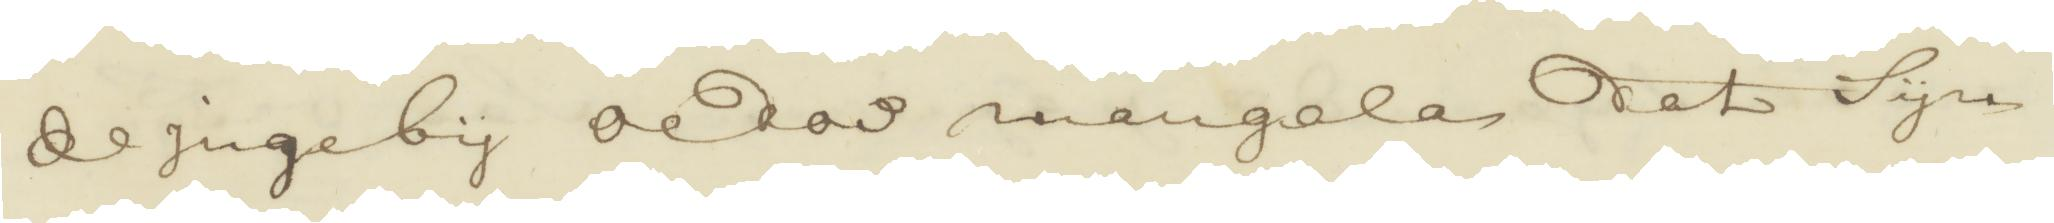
de jugebij oedoe mangola det sijn
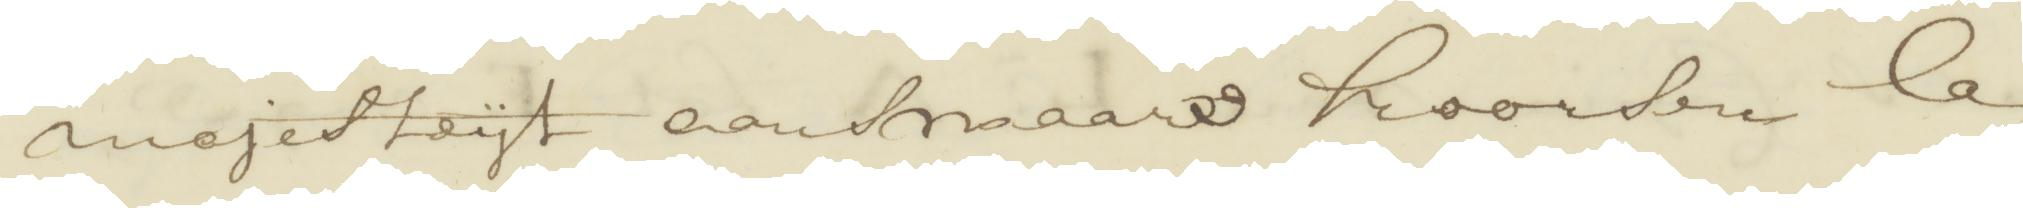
majesteijt aan swaare koorsen la
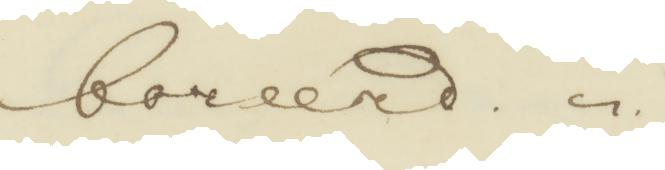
boreerd.
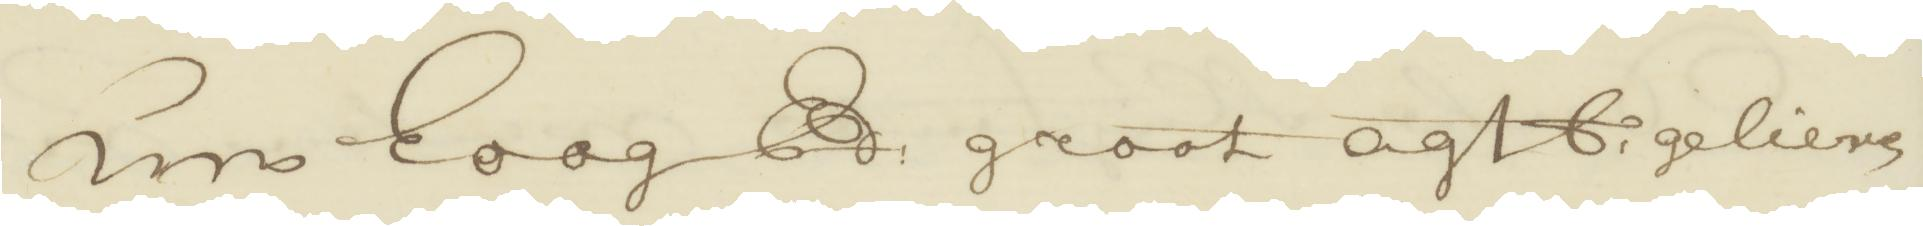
uw hoog Ed: groot agtb: gelieven
